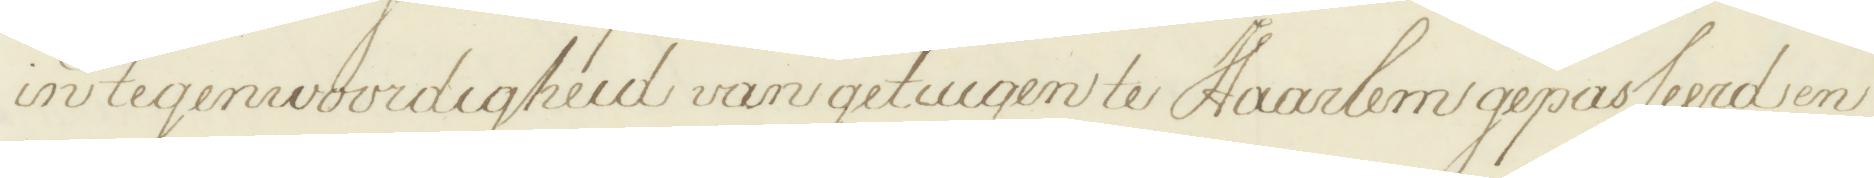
in tegenwoordigheid van getuigen te Haarlem gepasseerd en
